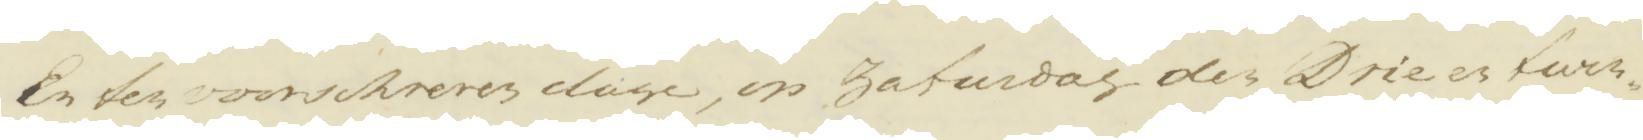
En ten voorschreven dage, op Zaturdag den Drie en twin
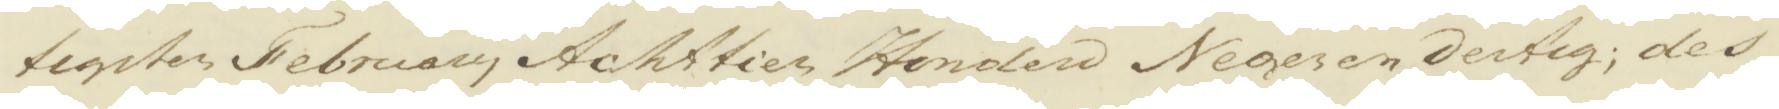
tigsten Febuary Achttien Honderd Negen en dertig; des
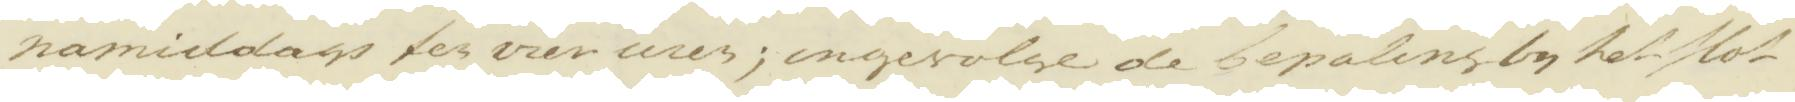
namiddags ten vier uren; ingevolge de bepaling bij het slot
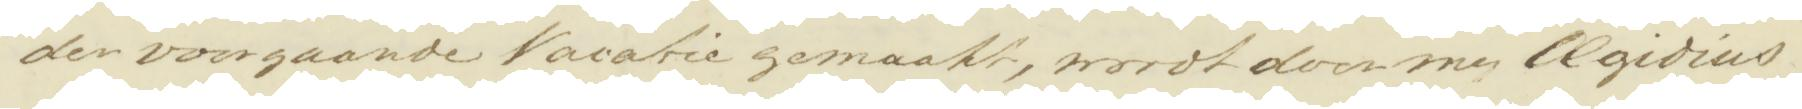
der voorgaande Vacatie gemaakt, wordt door my AEgidius
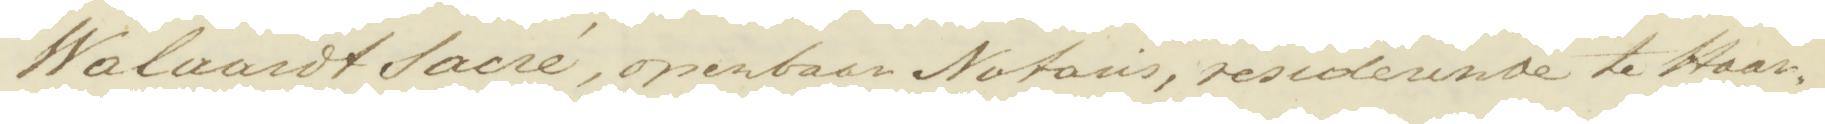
Walaardt Sacré, openbaar Notaris, residerende te Haar„
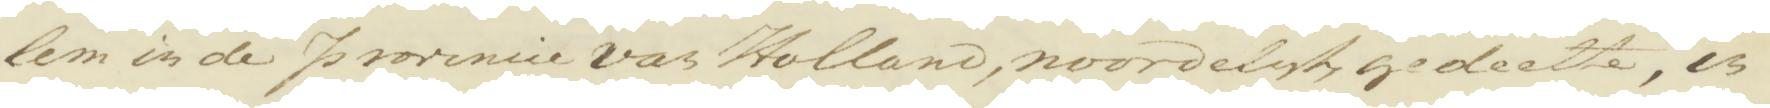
lem in de provincie van Holland, noordelyk gedeelte, in
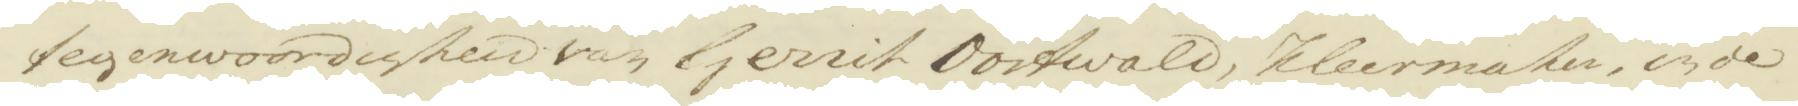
tegenwoordigheid van Gerrit Oostwald, kleermaker, in de
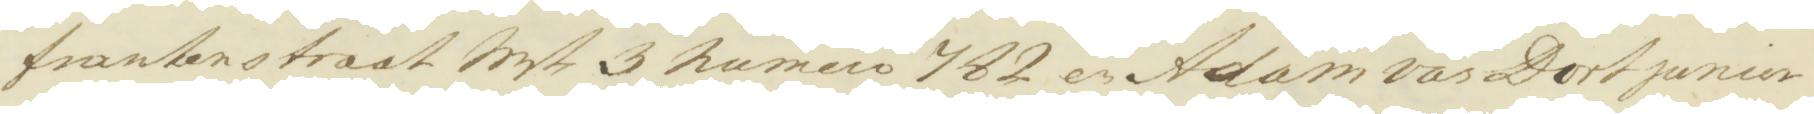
frankenstraat wyk 3 numero 782 en Adam vas Dort Junior
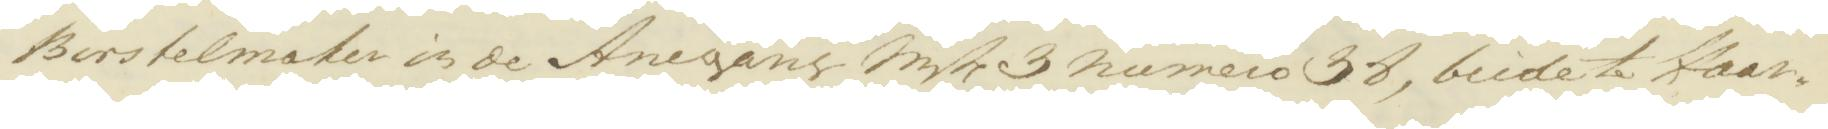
Borstelmaker in de Anegang wyk 3 numero 38, beide te Haar„
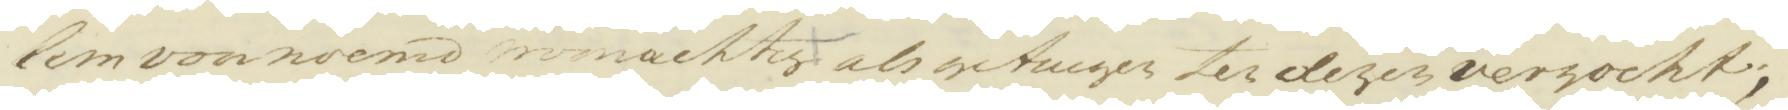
lem voornoemd woonachtig als getuigen ten dezen verzocht;
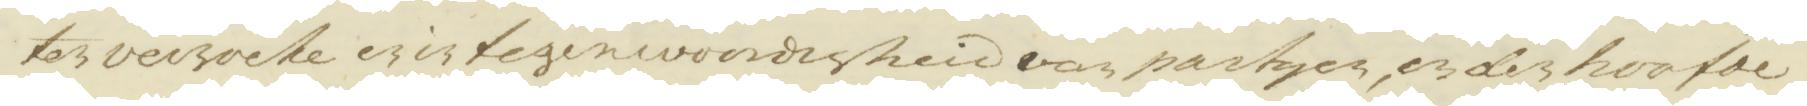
ten verzoeke en in tegenwoordigheid van partyen, in den hoofde
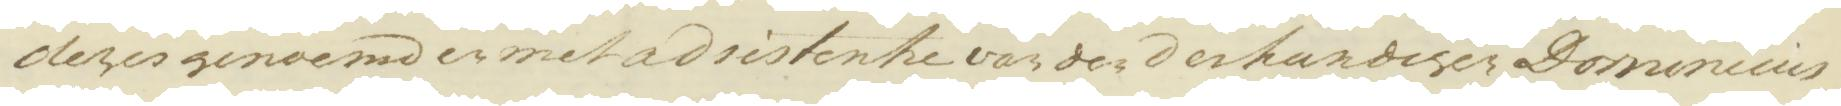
dezes genoemd en met adsistentie van den deshandigen Dominicus
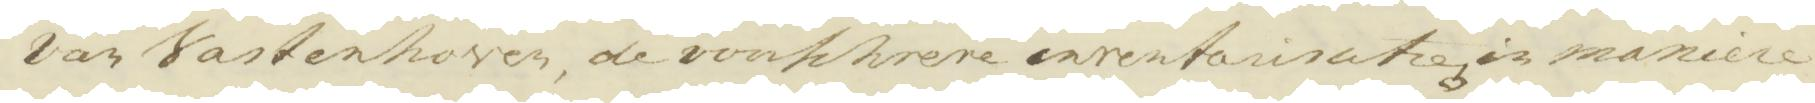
van Vastenhoven, de voorschreve inventarisatie ¶ in maniere
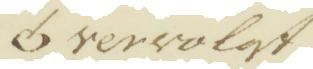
¶ vervolgt
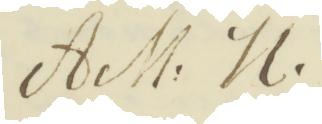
A M: H.
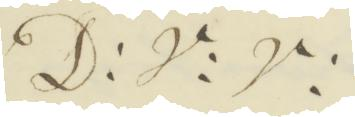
D: V: V:
